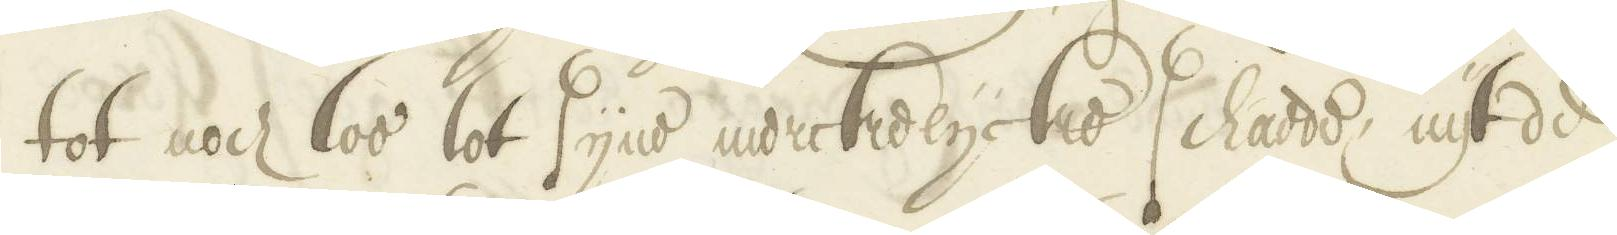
tot noch toe tot sijne werckelijcke schaede, uit de
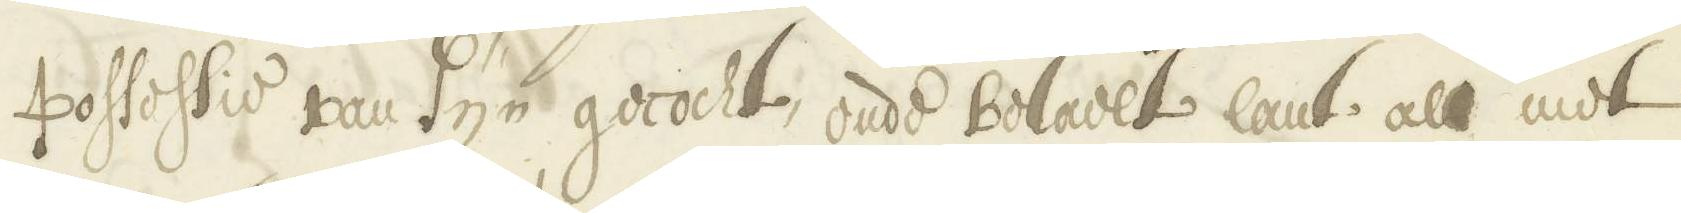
possessie van sijn gecocht, ende betaelt lant al met
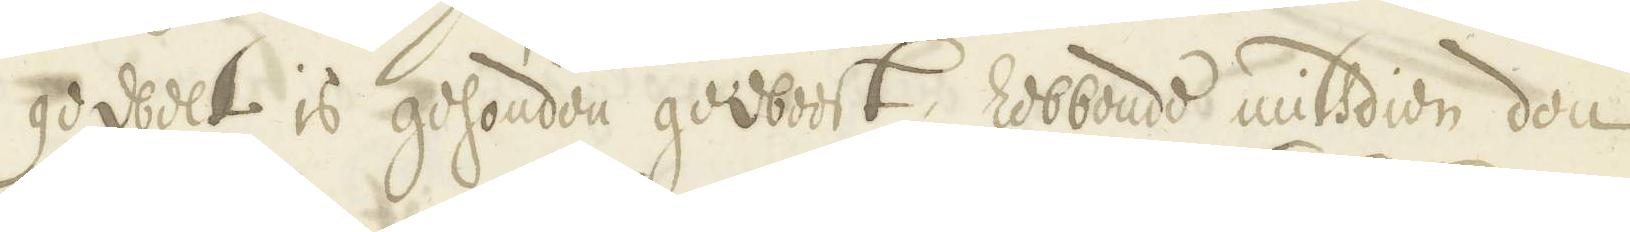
gewelt is gehouden geweest, hebbende mitsdien den
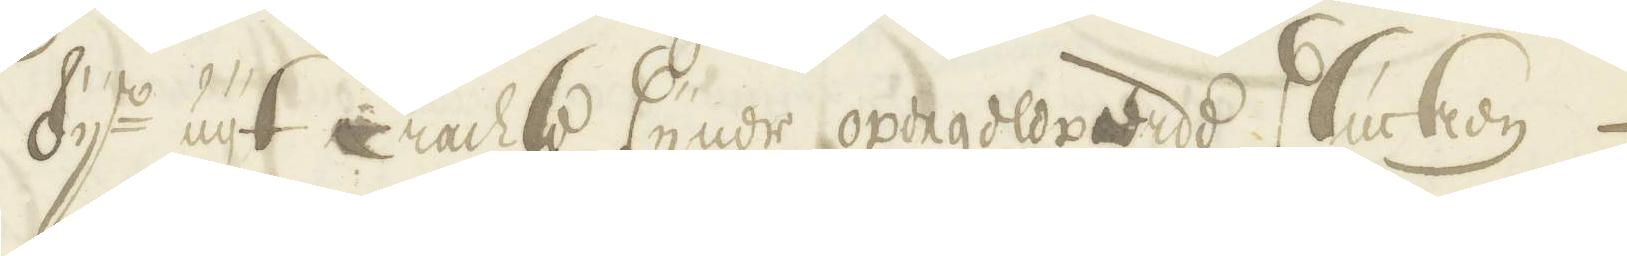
Eij=r uijt crachte sijner opergeleverde stucken
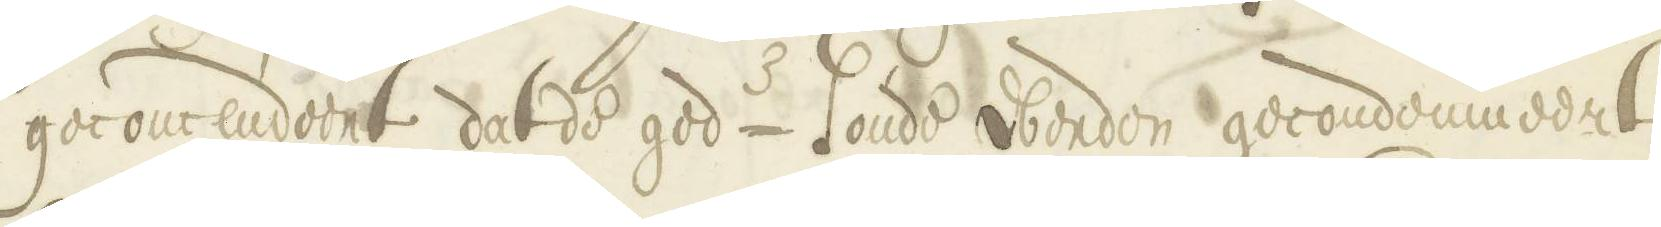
geconcludeert dat de ged=e soude werden gecondemneert
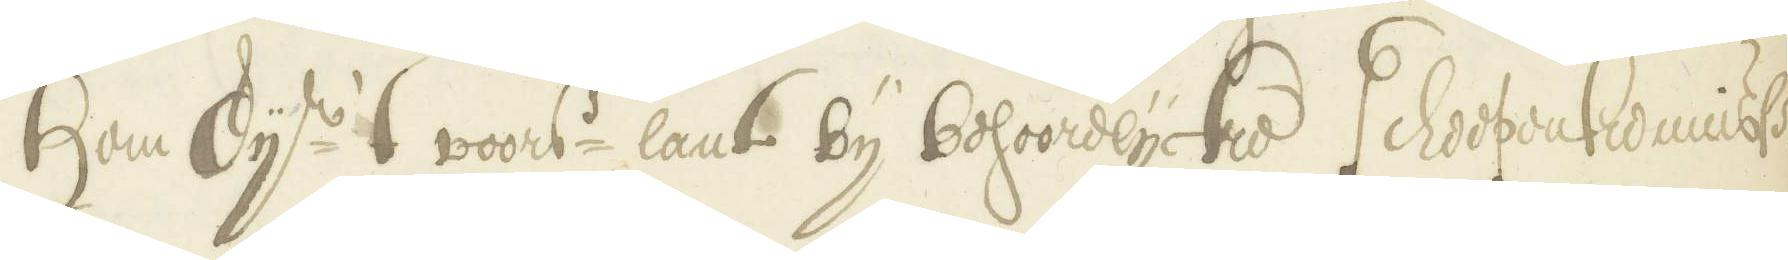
Hem Eij=r ’t voors=z lant bij behoorlijcke scheepenkennisse
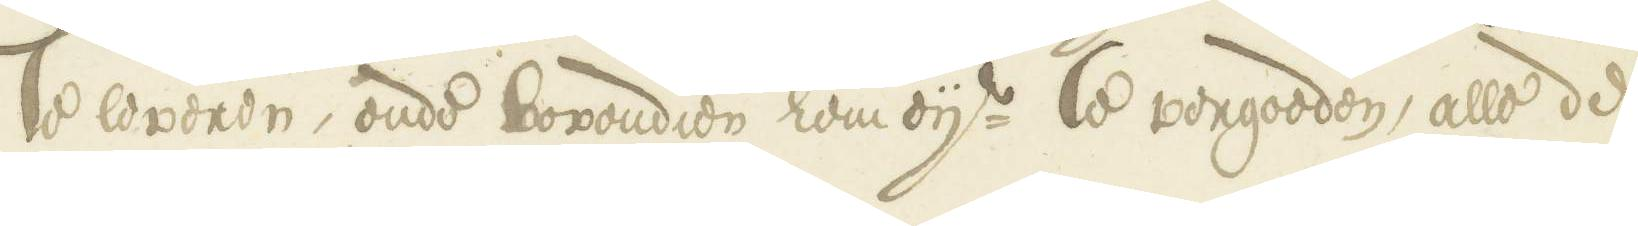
te leveren, ende bovendien hem eij=r te vergoeden, alle de
